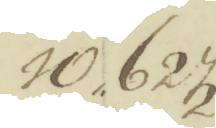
10„62½
